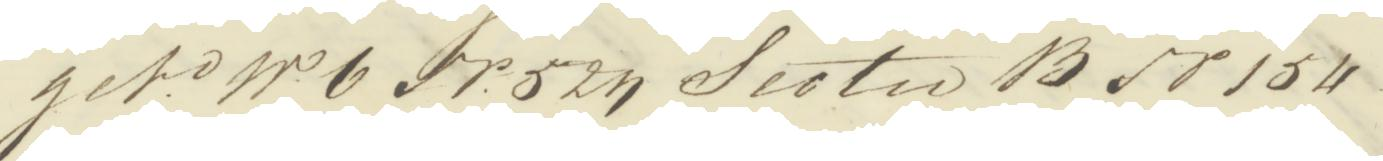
get.d W.6 N.o 524 Sectie B No 154
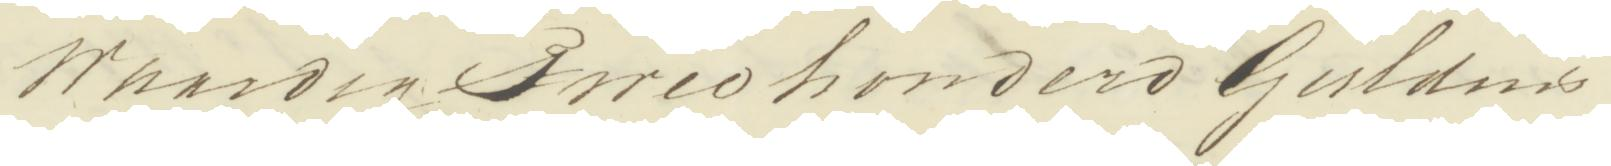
Waardig Twee honderd Guldens
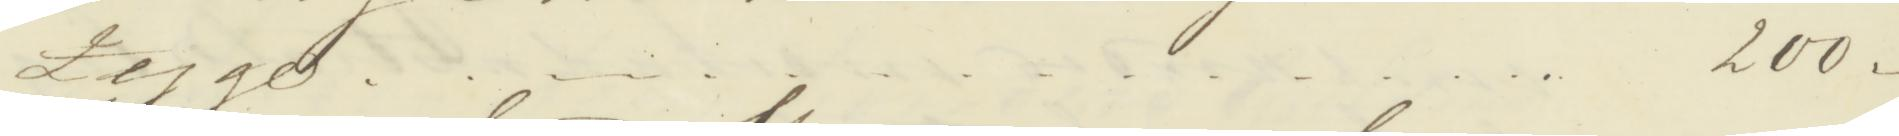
Zegge . . . - . . . . . . . . . . . . . .. 200.
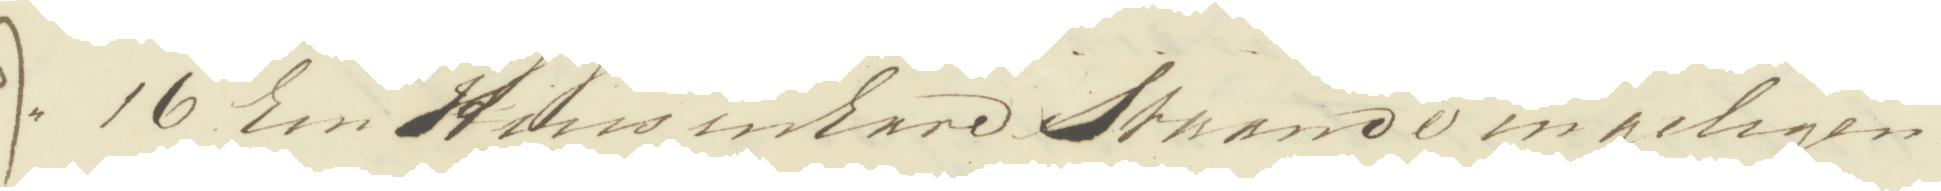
„ 16 Een Huis en Erve staande en gelegen
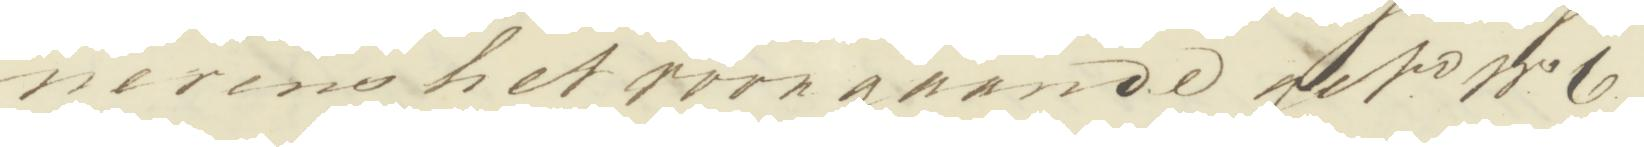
nevens het voorgaande getd W.6
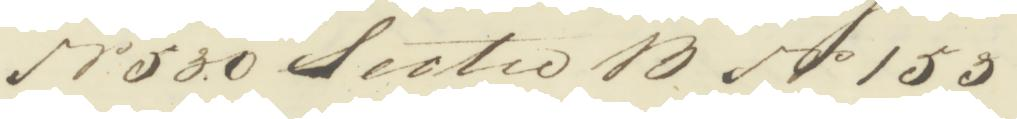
N.o 530 Sectie B No 153
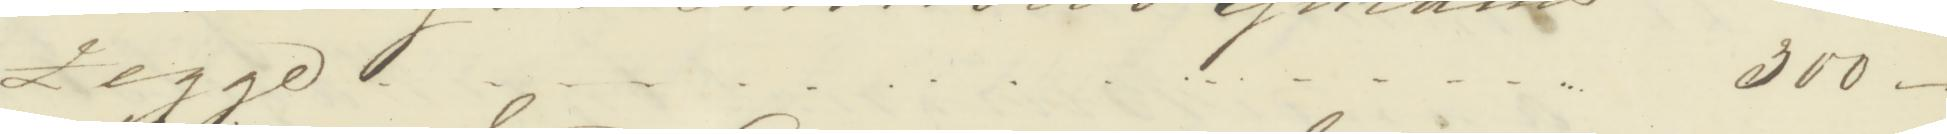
zegge - - - - . . . . . . .-. - - - - .. 300 —
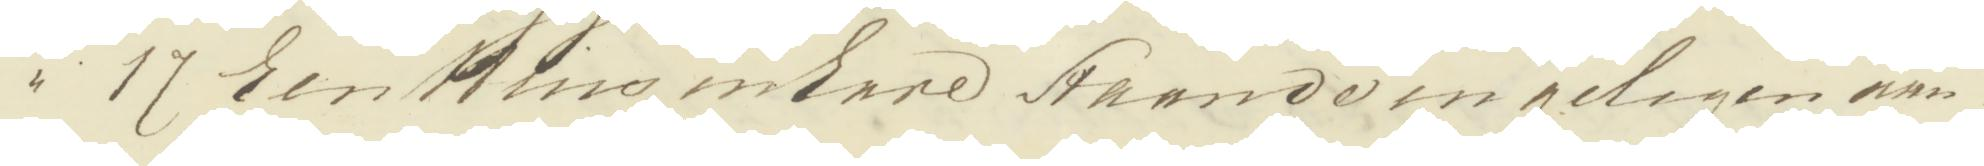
„ 17 Een Huis en Erve staande en gelegen aan
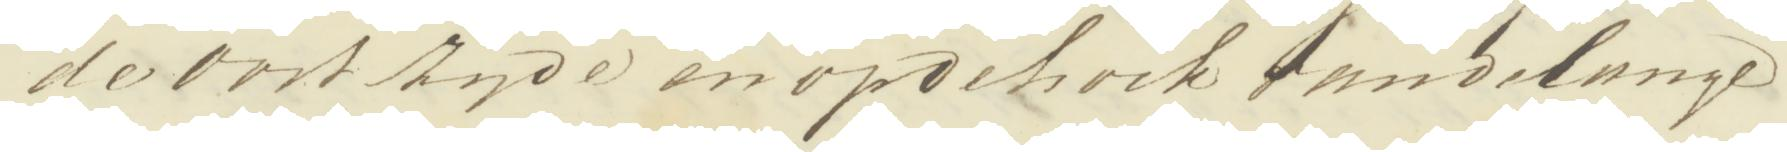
de Oost zyde en op de hoek van de lange
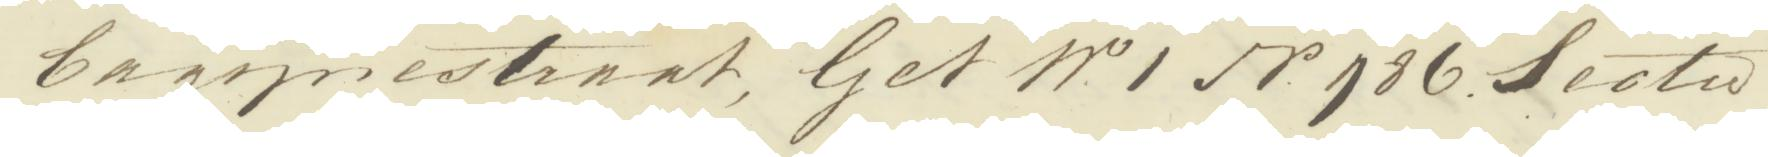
bagynestraat, Get W. 1 N.o 986. Sectie
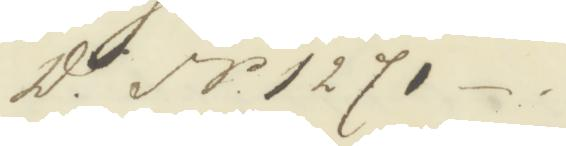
D. N.o 1271-.
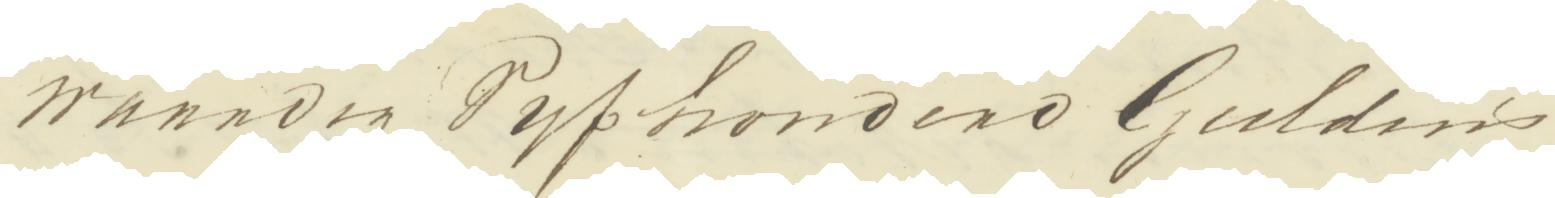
waardig Vyfhonderd Guldens
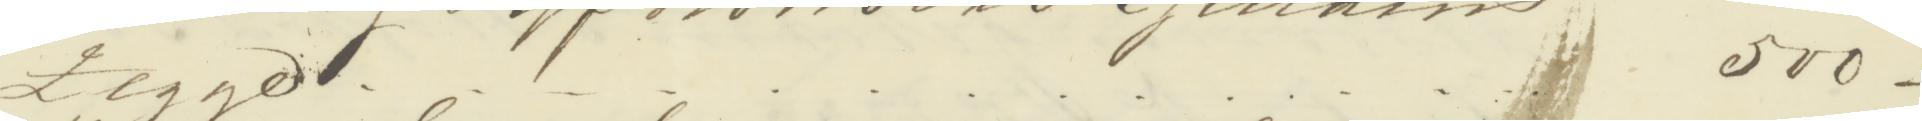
Zegge. . - - . . . . . . . . . . .. 500 -
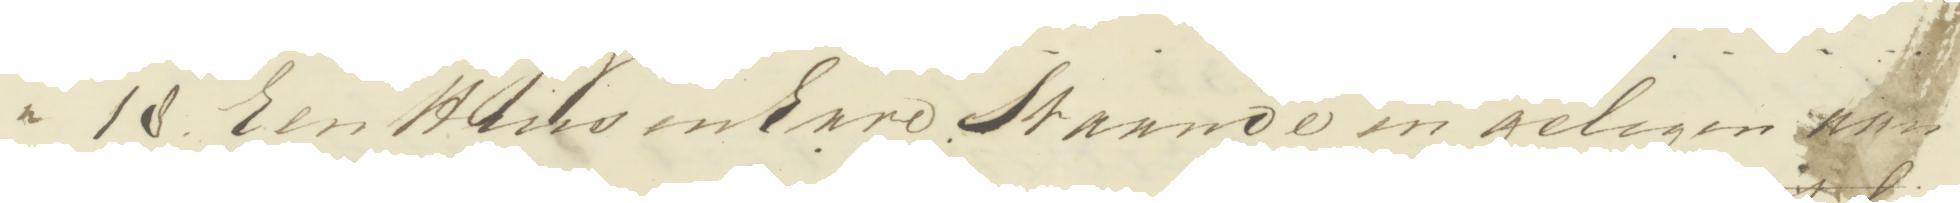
„ 18. Een Huis en Erve staande en gelegen aan
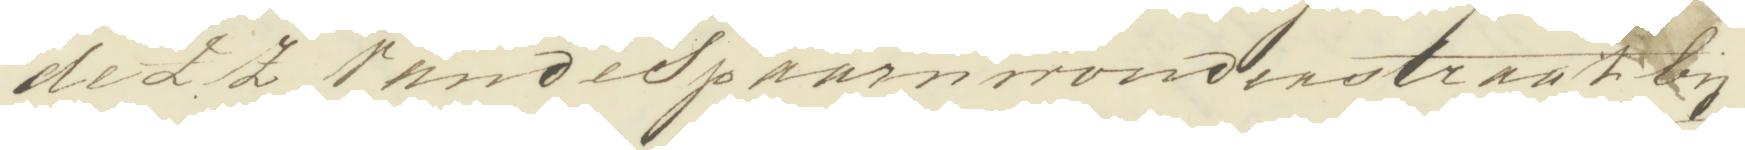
de Z. Z van de spaarnwouderstraat bij
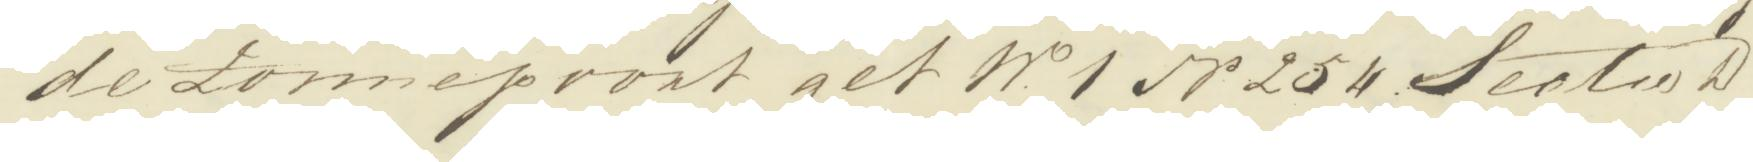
de Zonnepoort get W. 1 No 254 Sectie D
